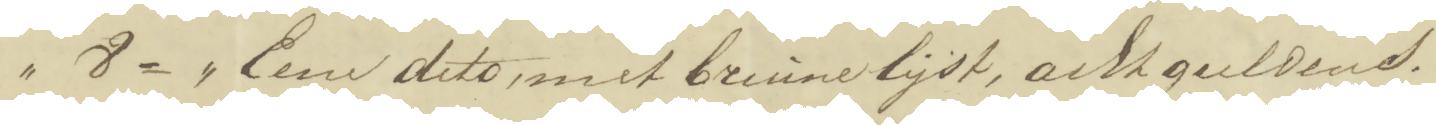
„ 8= „ Eene dito, met bruine lijst, acht guldens.
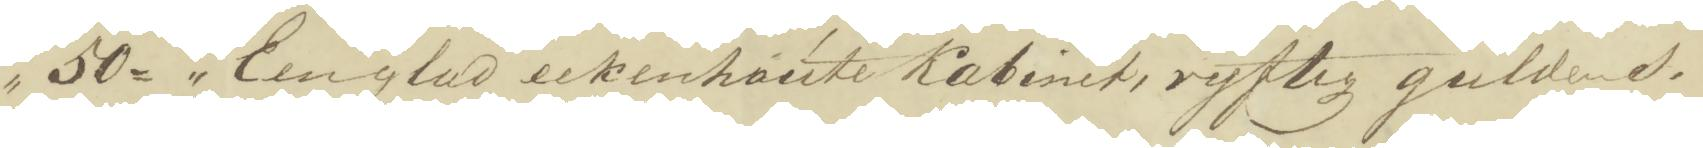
„ 50= „ Een glad eekenhoute Kabinet, vyftig guldens.
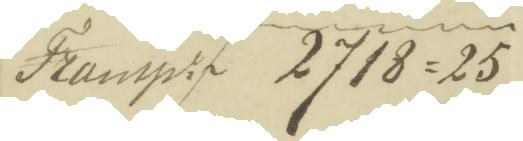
Transp„t ƒ 2718=25
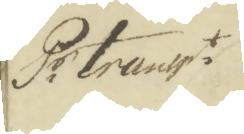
P„r transp„t
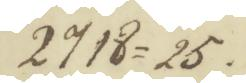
2718= 25.
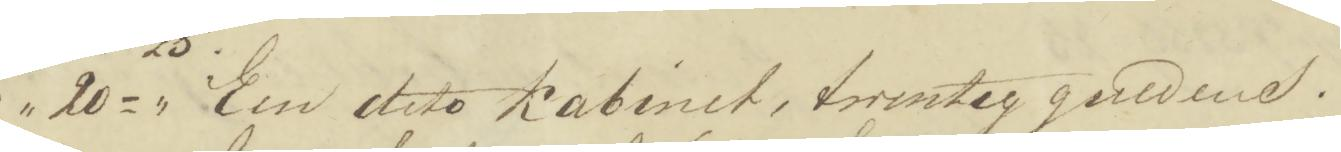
„ 20= „ Een dito Kabinet, twintig guldens.
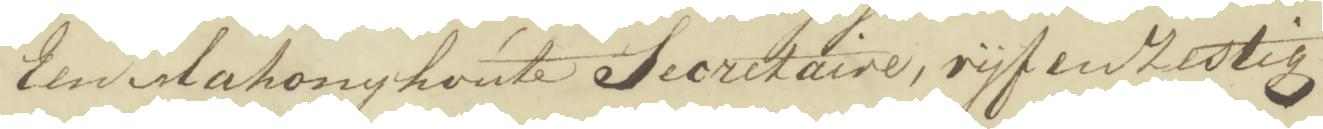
Een Mahonyhoute Secretaire, vijf en Zestig
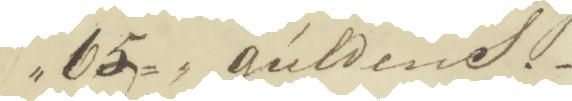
„65= „ guldens.
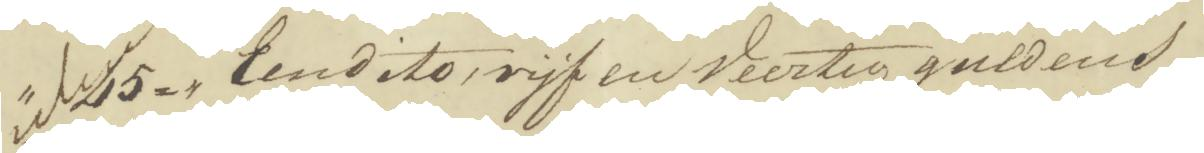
„45=„ Een dito, vijf en veertig guldens.
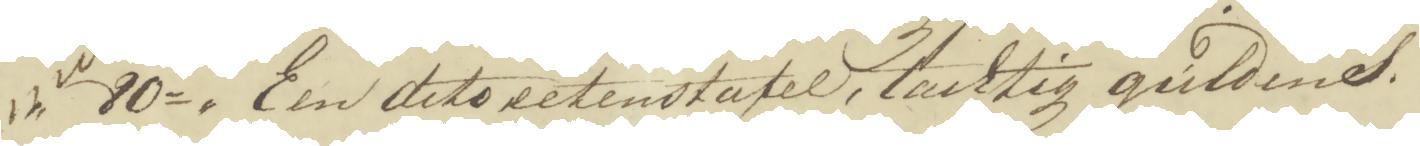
80= „ Een dito eetenstafel, tachtig guldens.
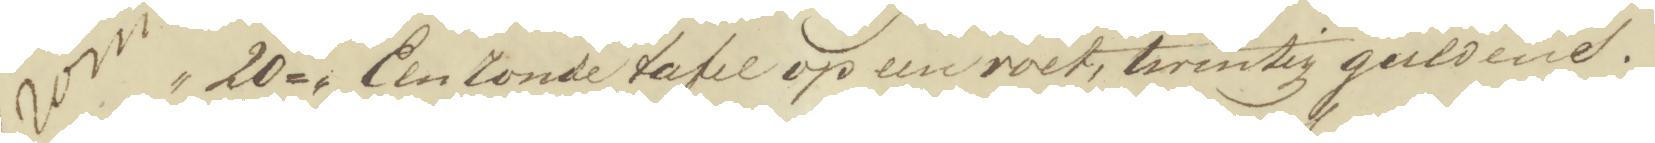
20=„ Een ronde tafel op een voet, twintig guldens.
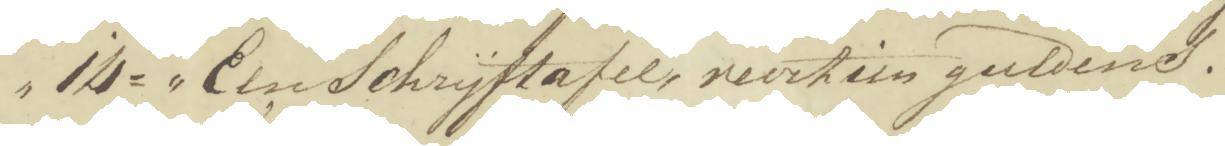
„ 14= „ Een Schrijftafel, veertien guldens.
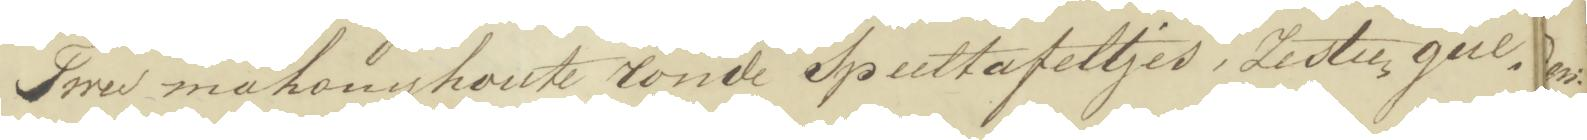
Twee mahonyhoute ronde speeltafeltjes, zestien gul„
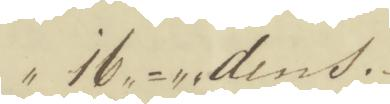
„ 16„=„ „dens.
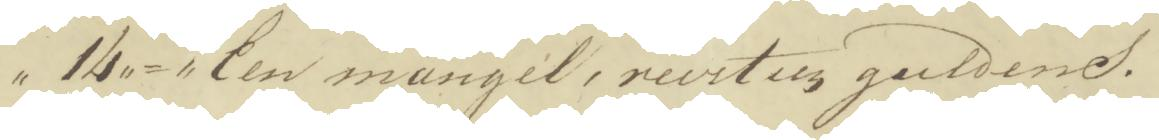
„ 14„=„ Een mangel, veertien guldens.
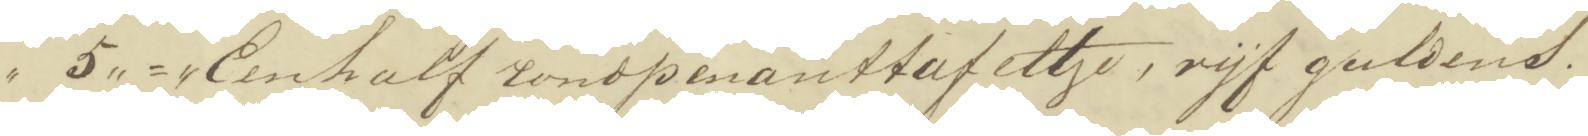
„ 5„ =„ Een half rond penanttafeltje, vijf guldens.
